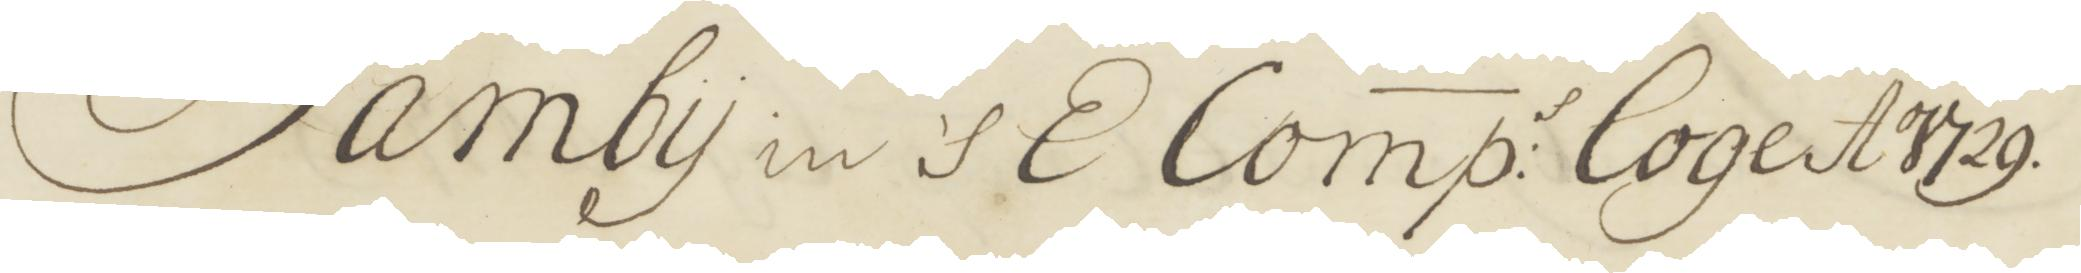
Jambij in ’s E Comp:s loge Ao 1729.
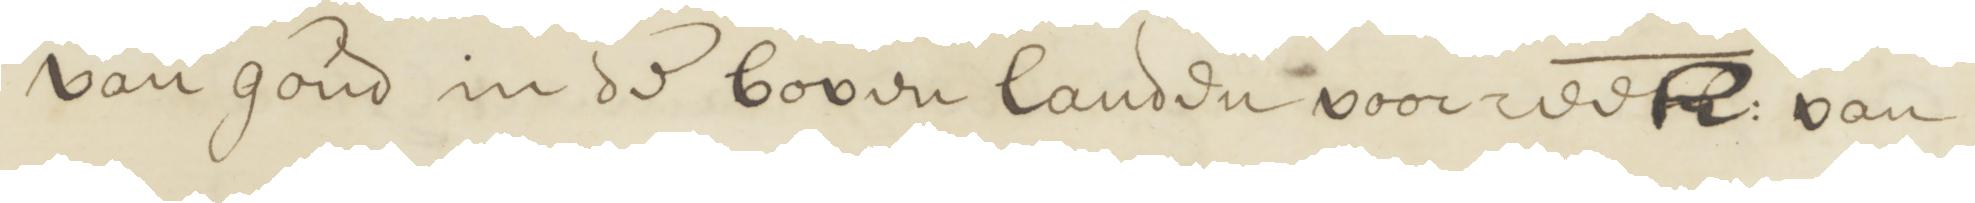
van goud in de boven landen voor reek: van
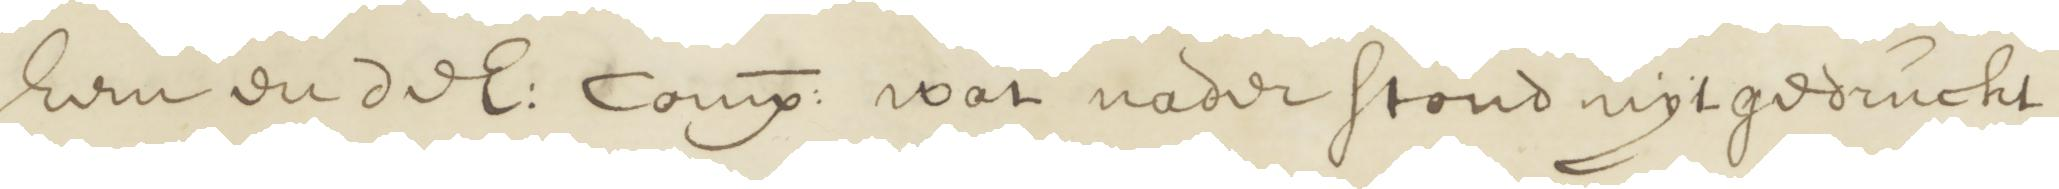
hem en de E: Comp: wat nader stond uijtgedruckt
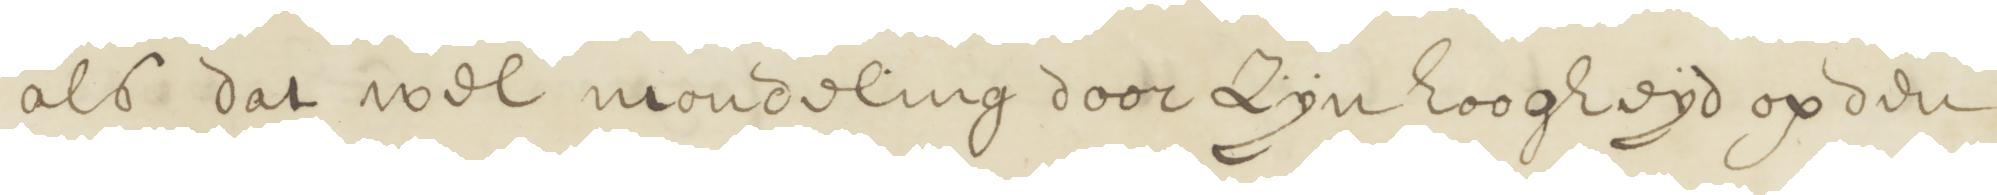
als dat wel mondeling door zijn hoogheijd op den
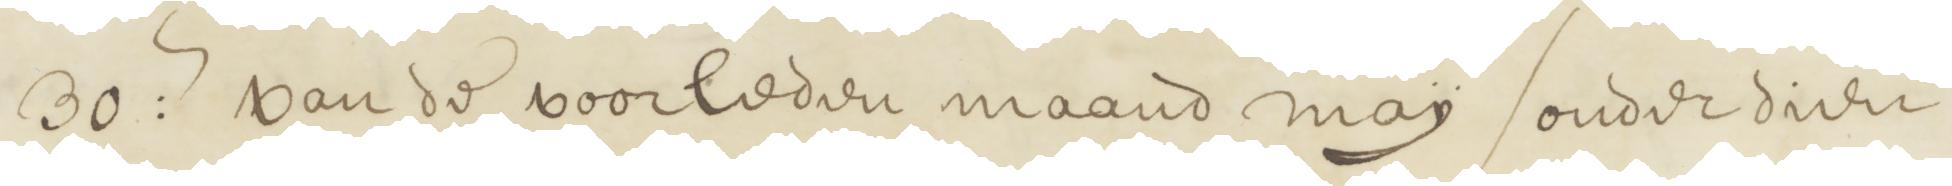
30:' van de voorleden maand maij / onder dien
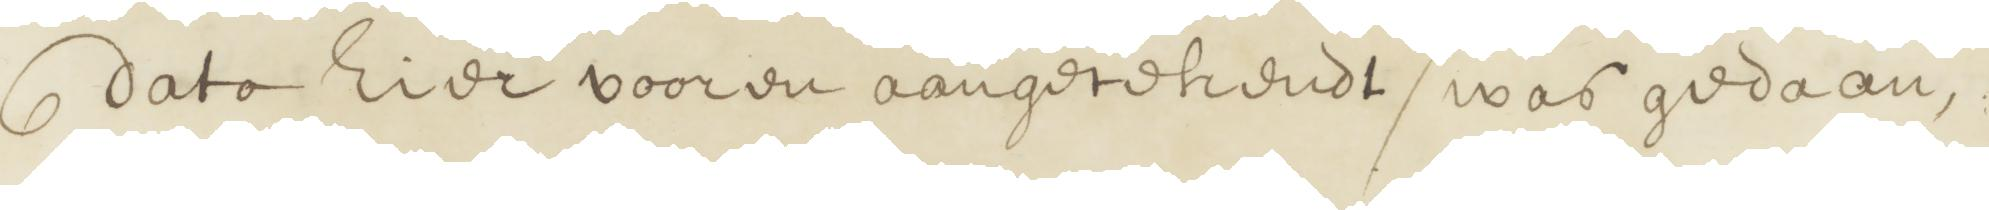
dato hier vooren aangetekendt / was gedaan,
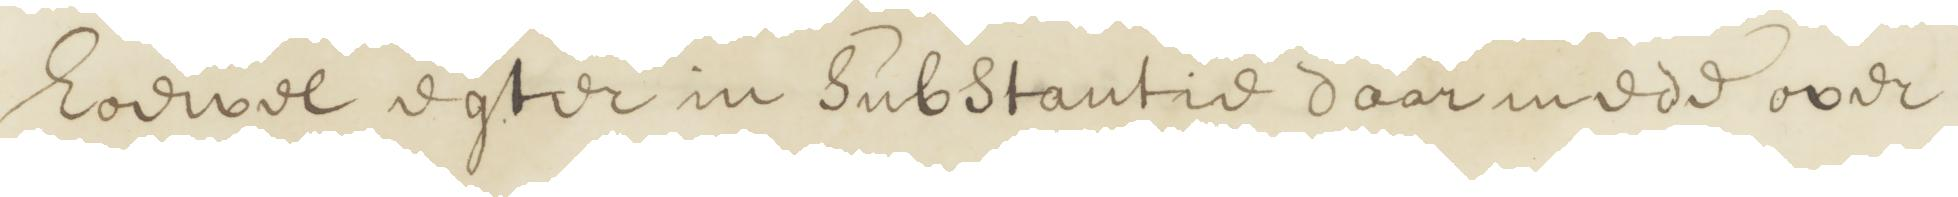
hoewel egter in substantie daarmede over
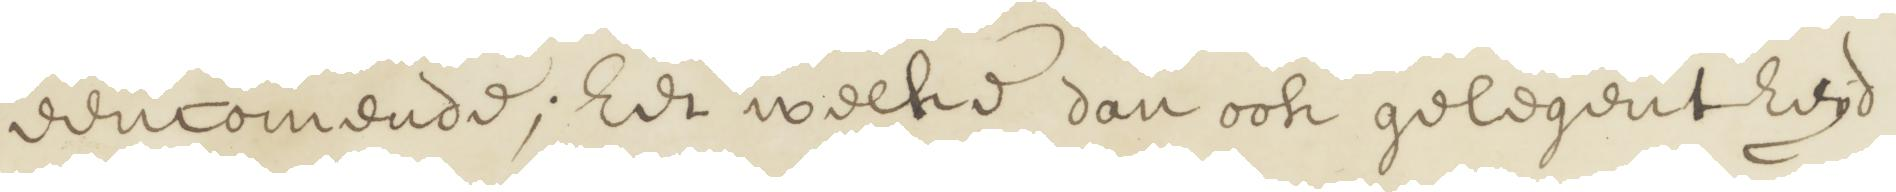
eencomende; het welke dan ook gelegentheijd
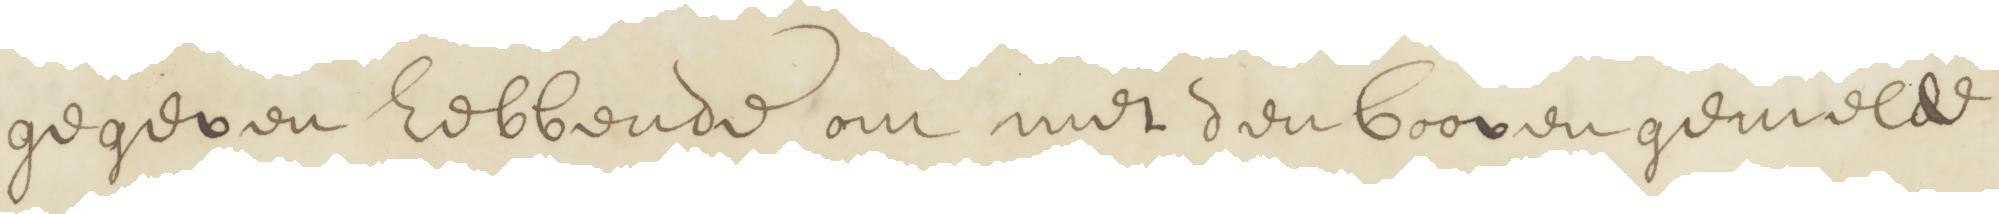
gegeven hebbende om met den booven gemelde
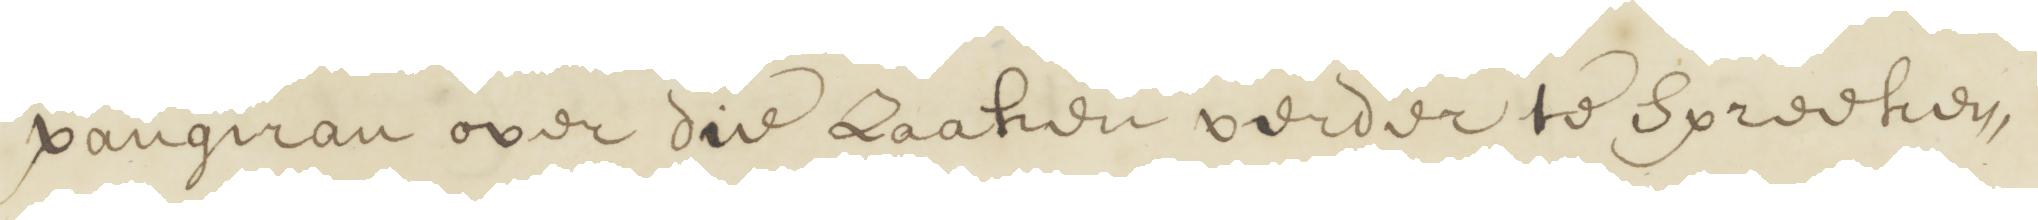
pangiran over die zaaken verder te spreeken„
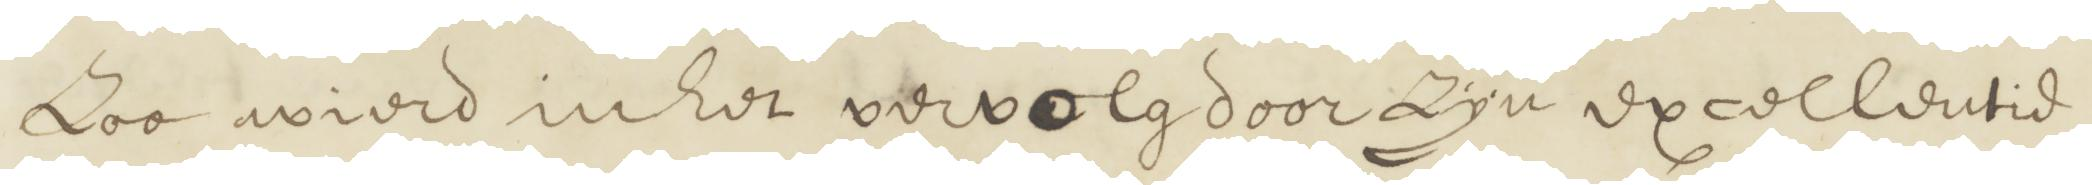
zoo wierd in het vervolg door zijn excellentie
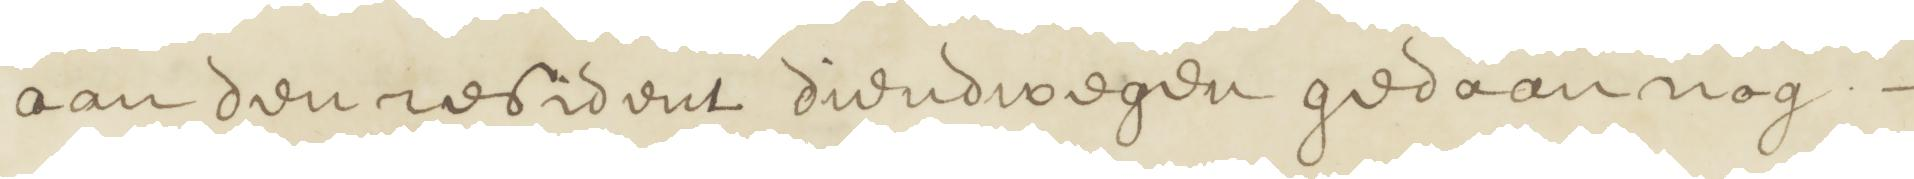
aan den resident diendwegen gedaan nog. -
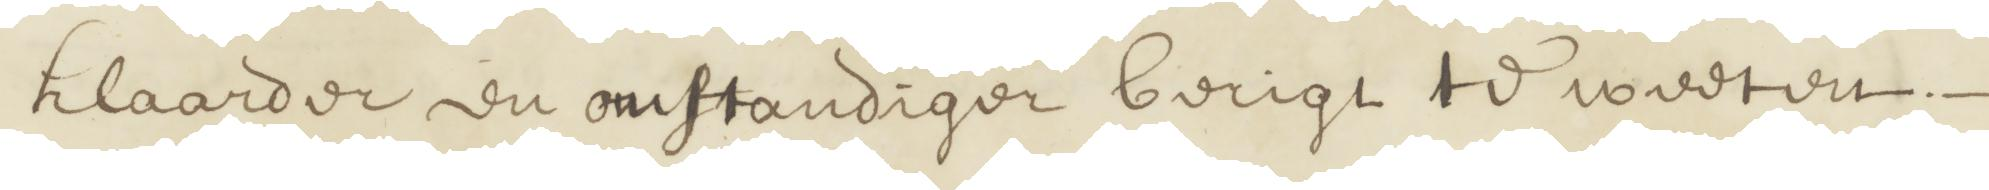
klaarder en omstandiger berigt te weeten. -
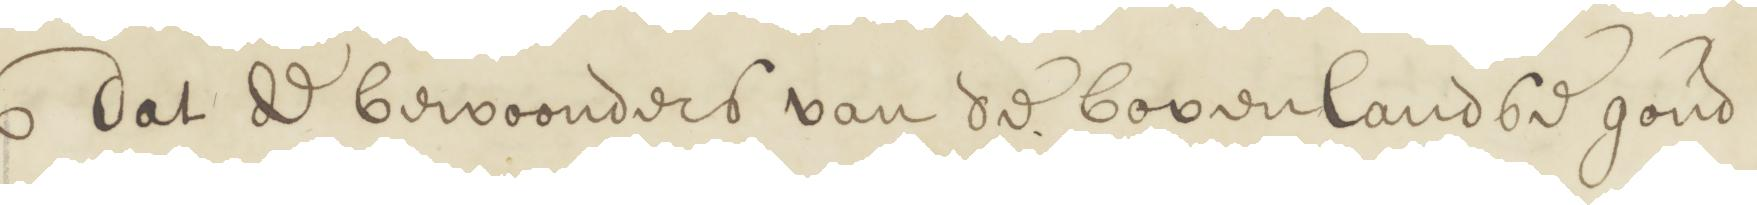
dat de bewoonders van de bovenlandse goud
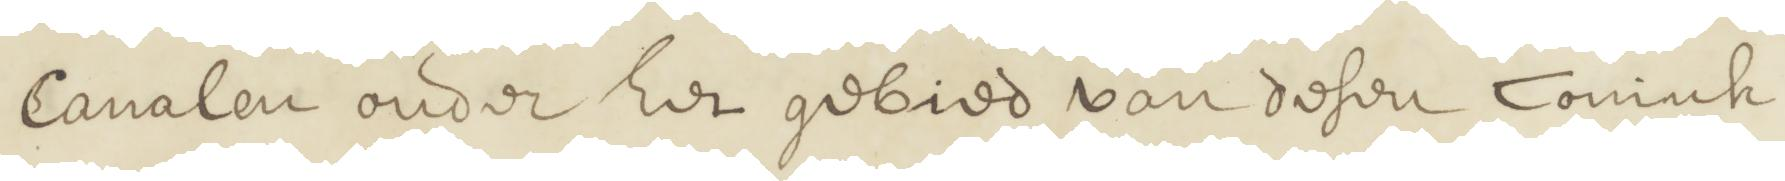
Canalen onder het gebied van desen Conink
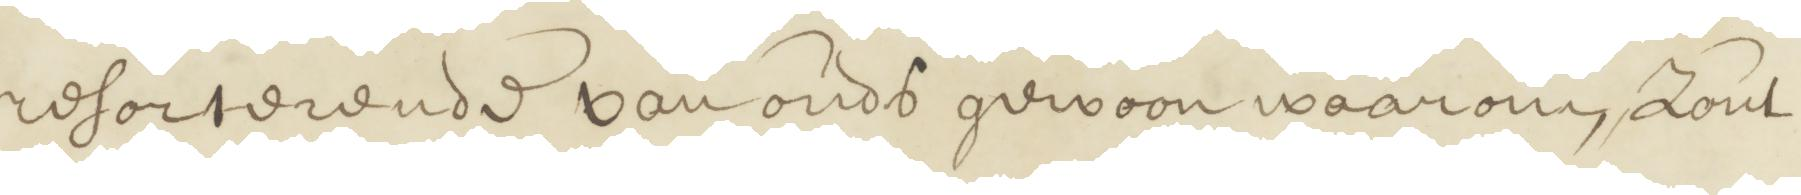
resorterende van ouds gewoon waarom, zout
